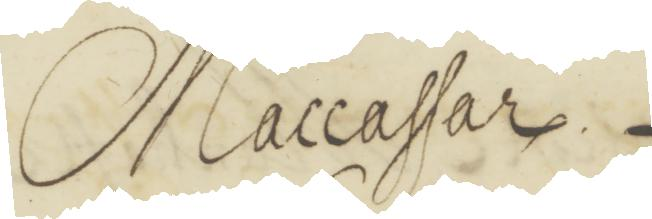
Maccassar.
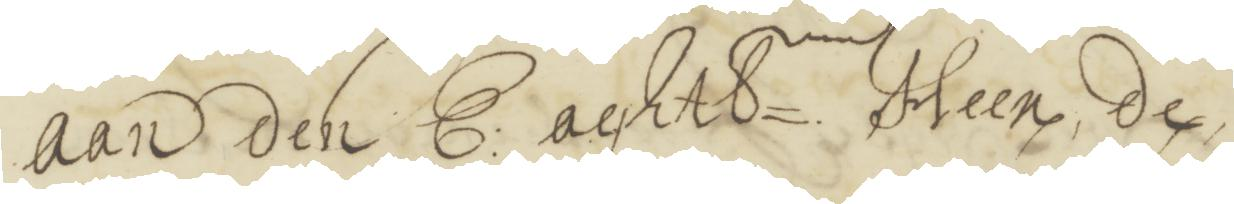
aan den E: aghtb=.n Heer, de
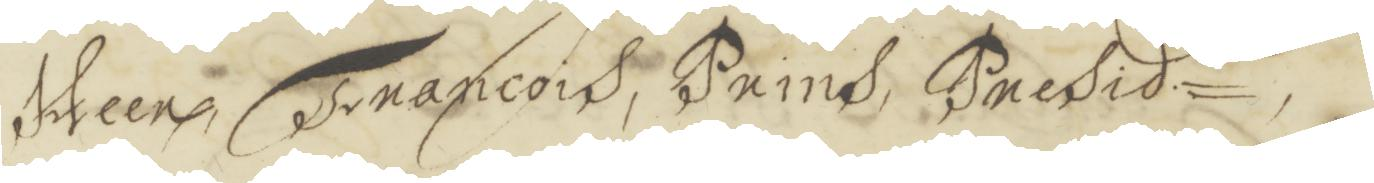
Heer, Francois, Prins, Presid=ent
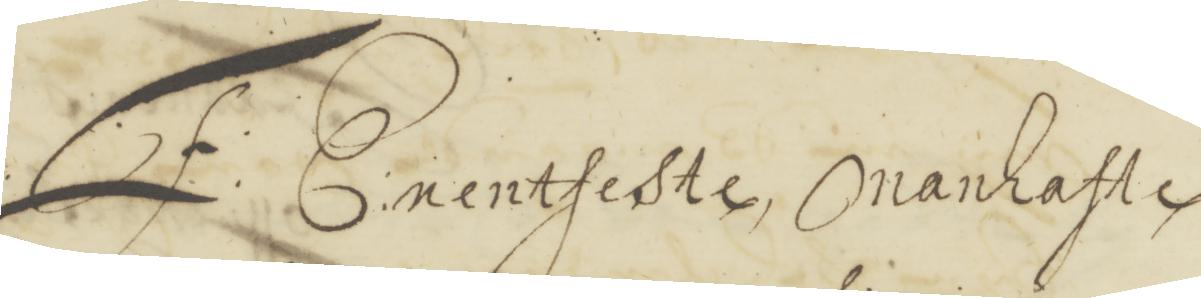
E: E.rentfeste, manhafte
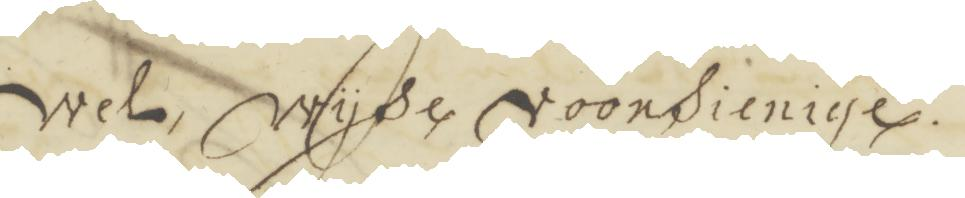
wel, wijse voorsienige.
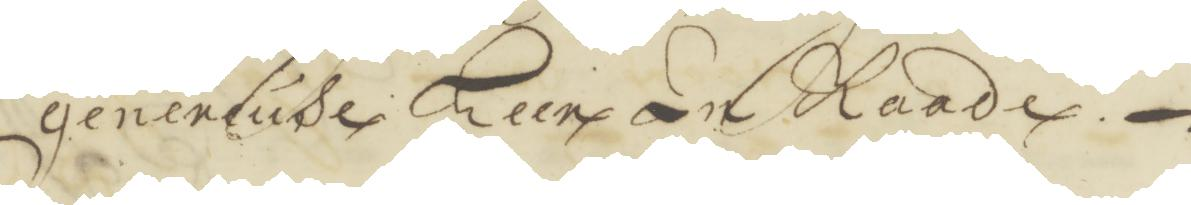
genereuse heer En Raade. —
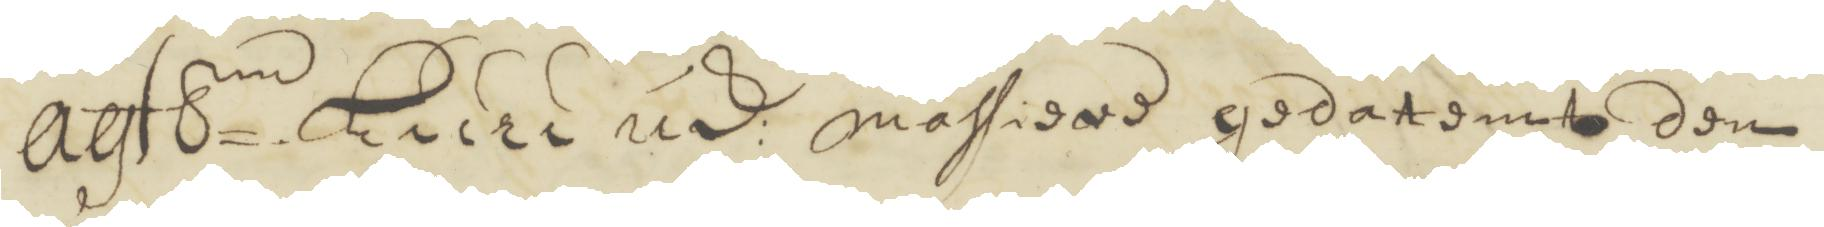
agtb=n heere uE: massieve gedatemt den
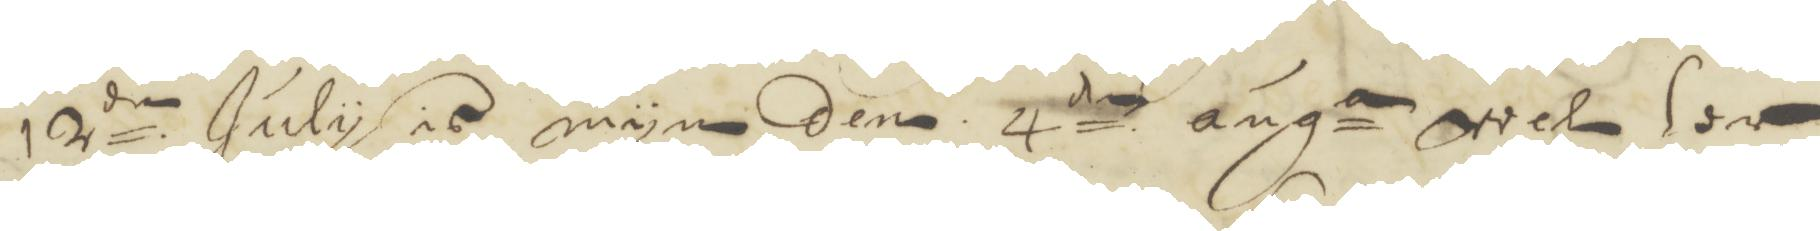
12=en Julij is mijn den 4=den aug=o wel ter
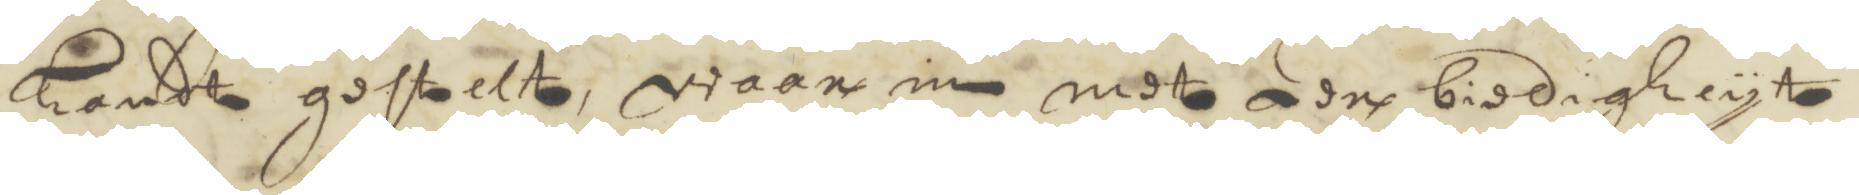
handt gestelt, waar in met Eer biedigheijt
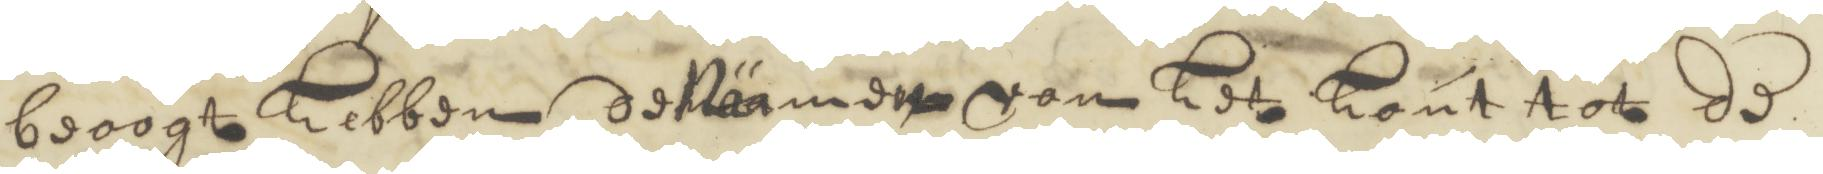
beoogt hebben de 12 ärmen van het hout tot de
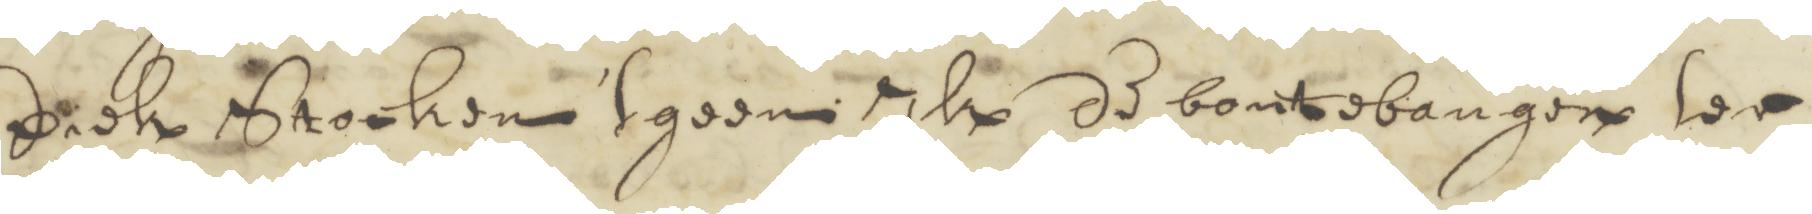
piek stocken 't geen Jk de bontebanger ter
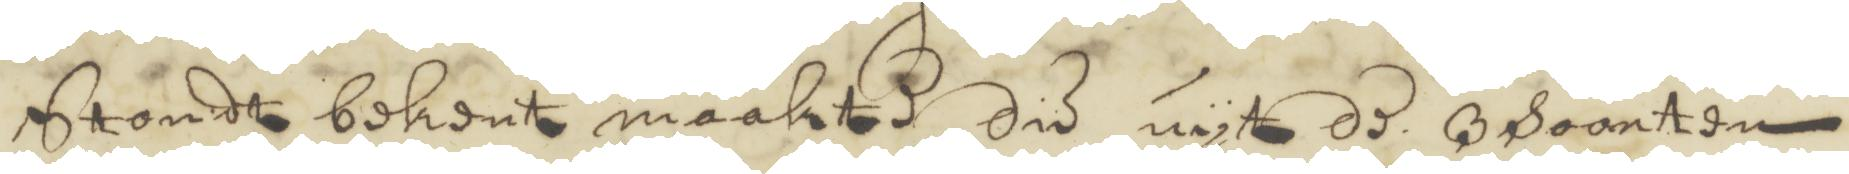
stondt bekent maakte die uijt de 3 soorten
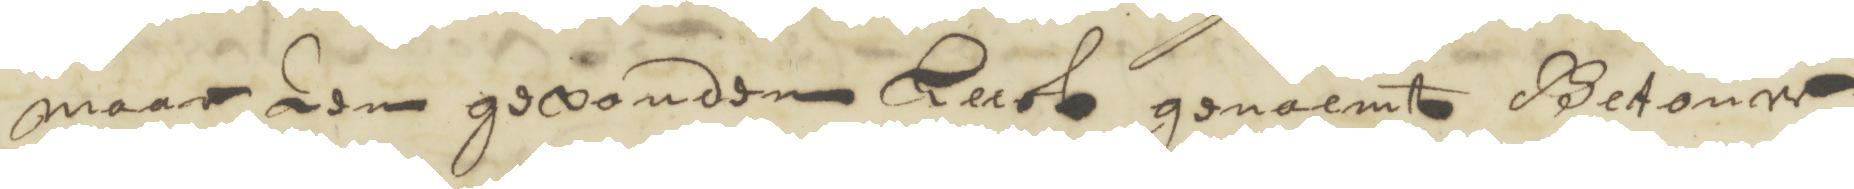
maar Een gevonden heeft genoemt Betouw
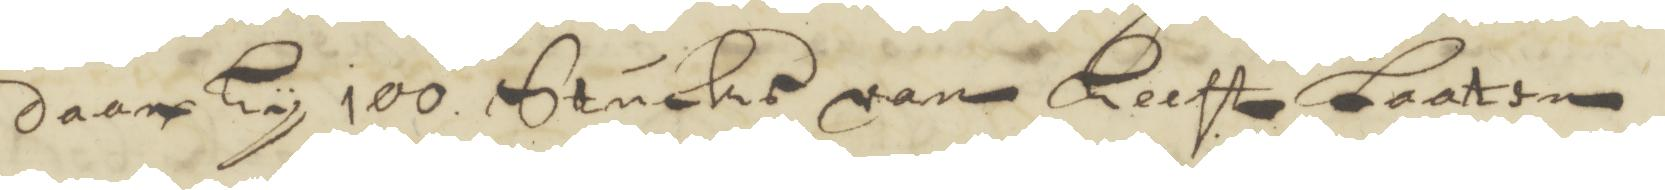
daar hij 100. stucks van heeft laaten
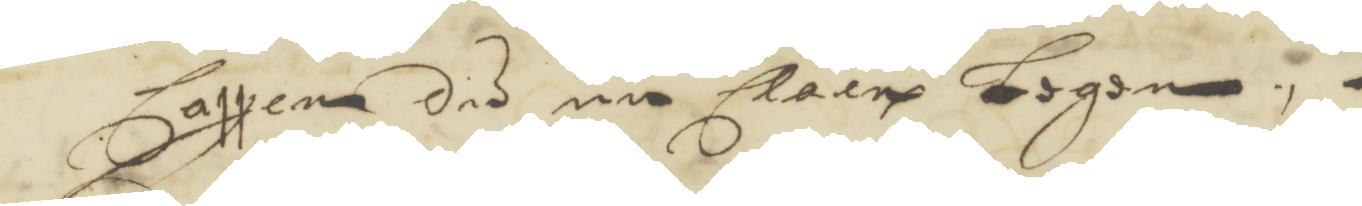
Cappen die nu Claer tegen.,
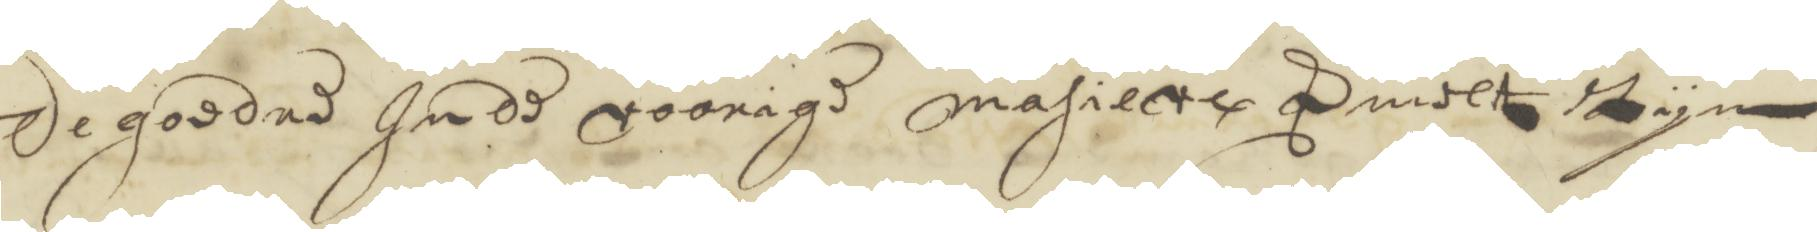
de goedre jn de voorige masieve vermelt zijn
